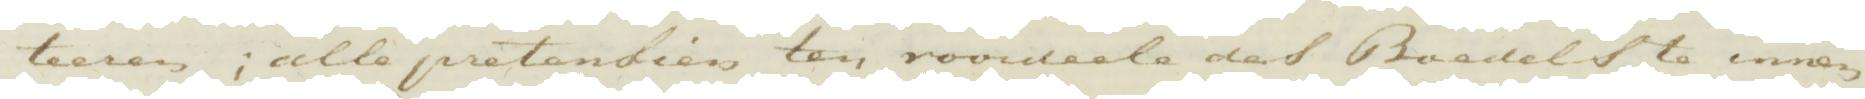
teeren; alle pretentien ten voordeele des Boedels te innen
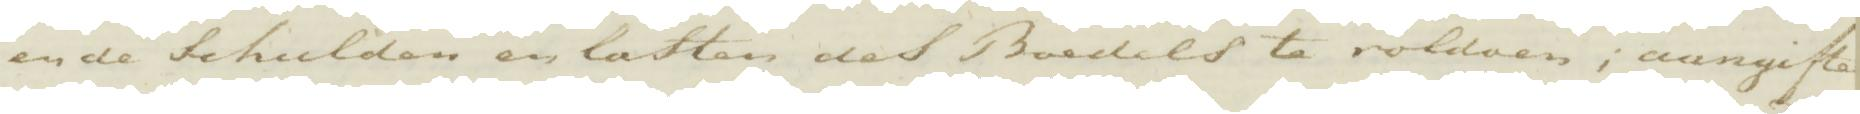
en de schulden en lasten des Boedels te voldoen; aangifte
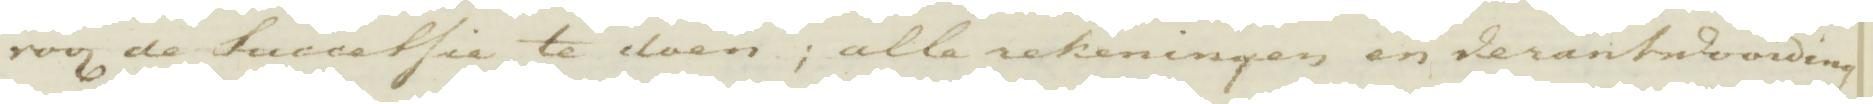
voor de successie te doen; alle rekeningen en verantwoording
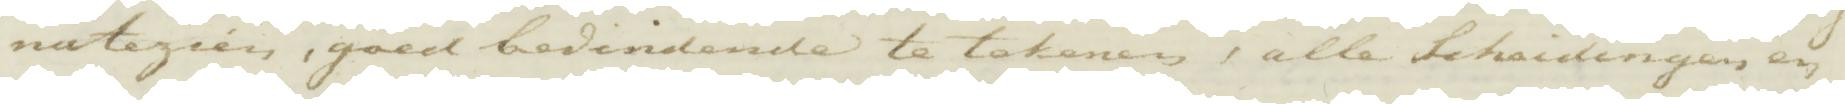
na tezien, goed bevindende te tekenen, alle scheidingen en
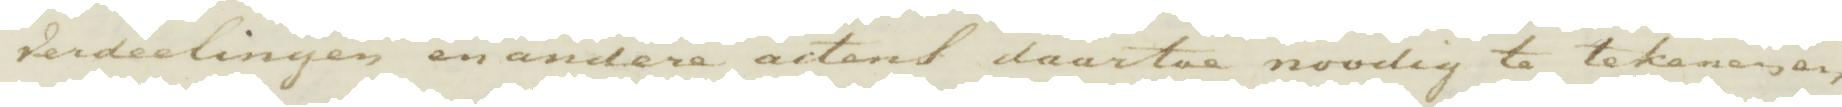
verdeelingen en andere actens daartoe noodig te tekenen en
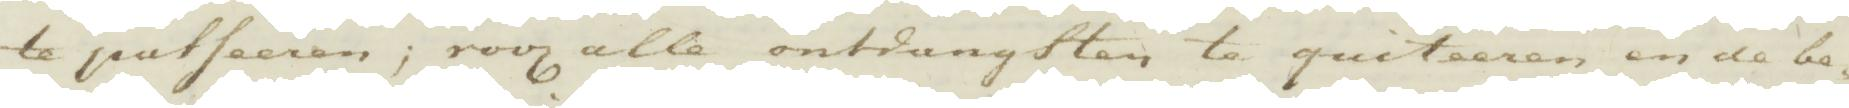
te passeeren; voor alle ontvangsten te quiteeren en de be
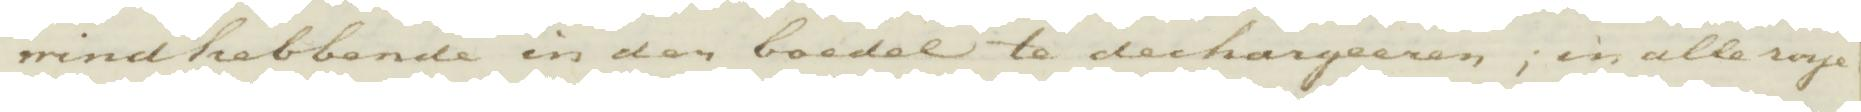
windhebbende in den boedel te dechargeeren; in alle roye
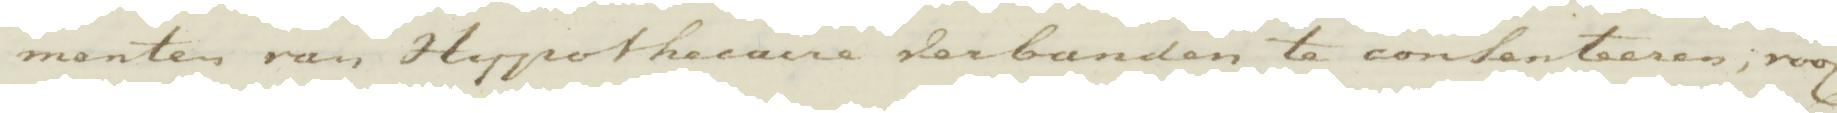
menten van Hypothecaire verbanden te consenteeren; voor
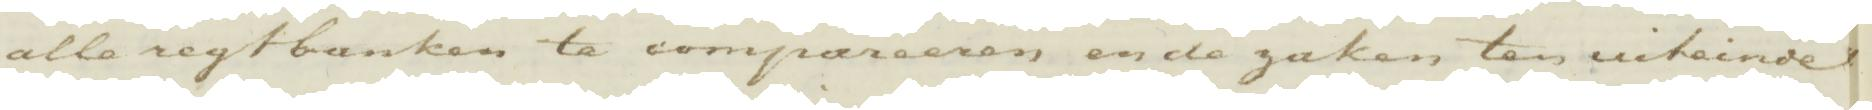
alle regtbanken te compareeren en de zaken ten uiteinde
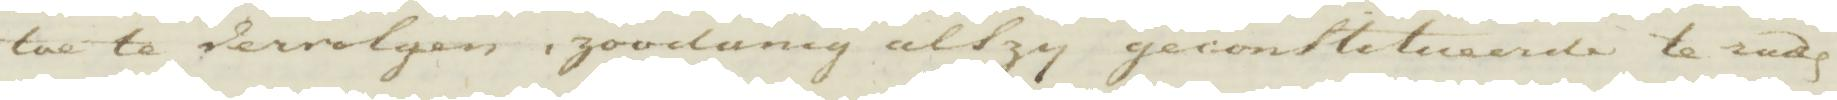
toe te vervolgen, zoodanig als zy geconstitueerde te raden
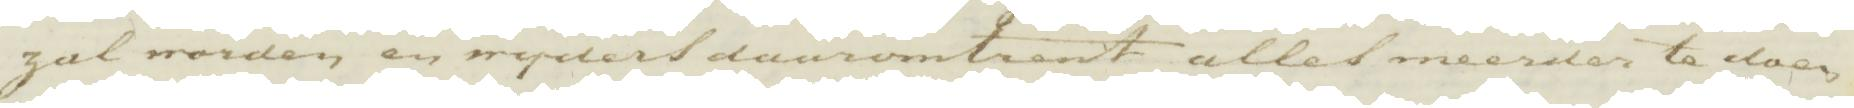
zal worden en wyders daaromtrent alles meerder te doen
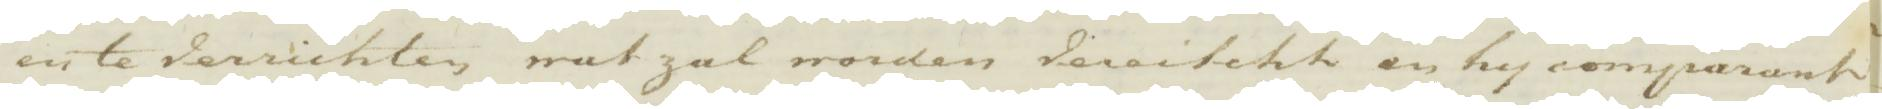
en te verrichten wat zal worden vereischt en hy comparant
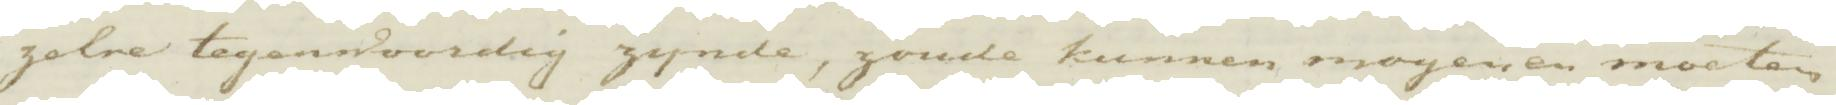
zelve tegenwoordig zynde, zoude kunnen mogen en moeten
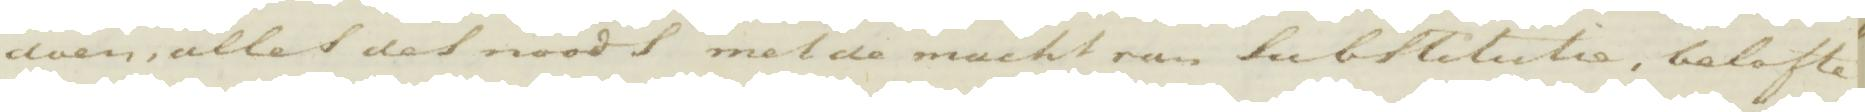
doen, alles des noods met de macht van substitutie, belofte
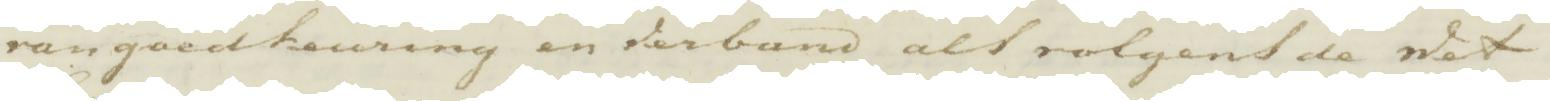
van goedkeuring en verband als volgens de wet.
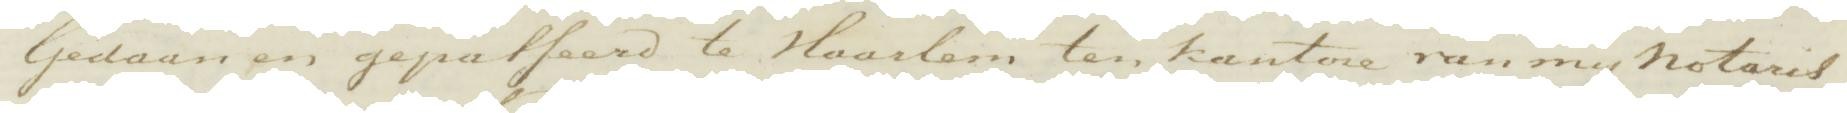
Gedaan en gepasseerd te Haarlem, ten kantore van my notaris
